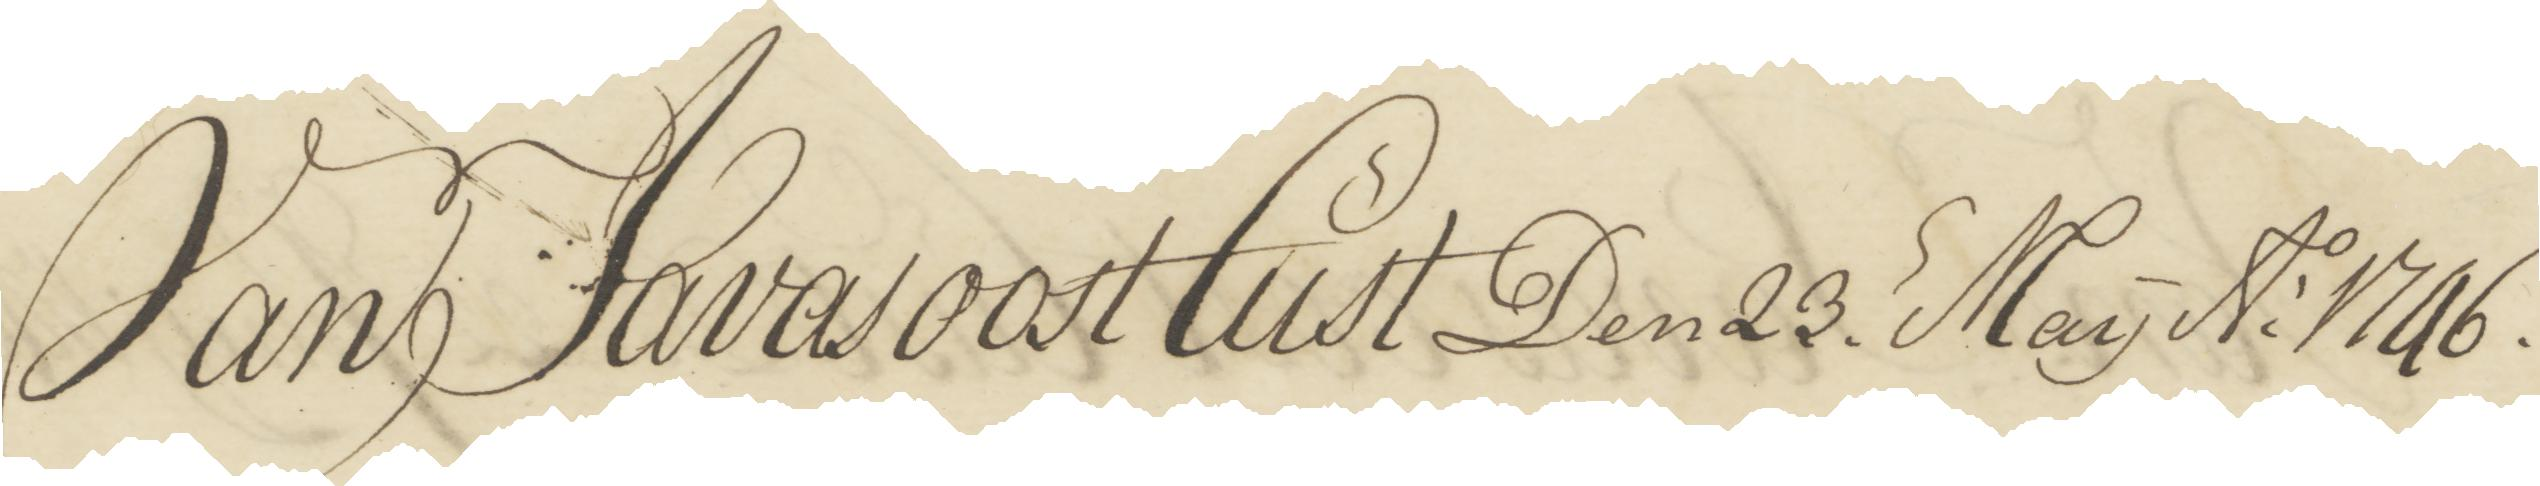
Van Javas oost Cust Den 23.' Maij A:o 1746.
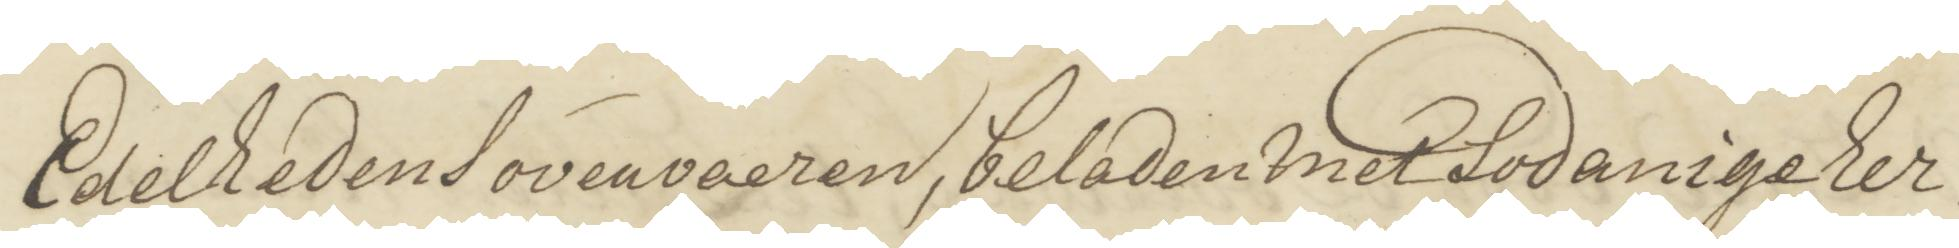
Edelhedens overvaeren, beladen met sodanige her
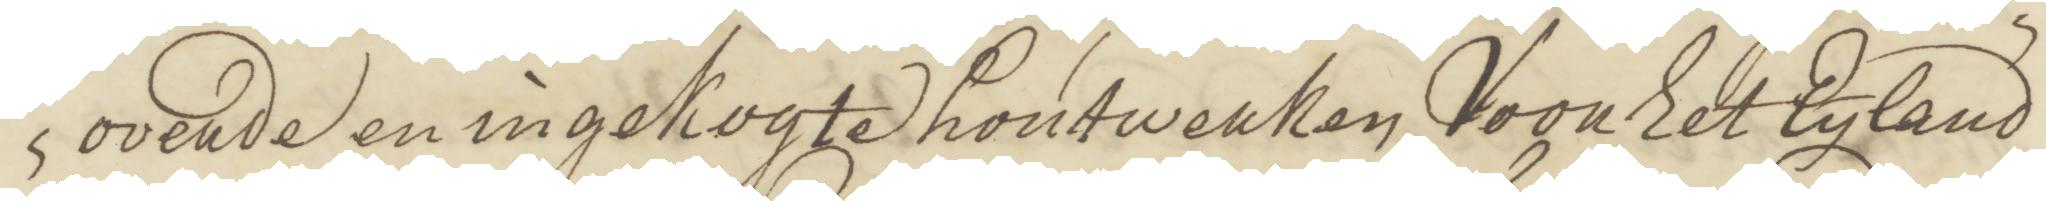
„overde en ingekogte houtwerken voor het Eijland
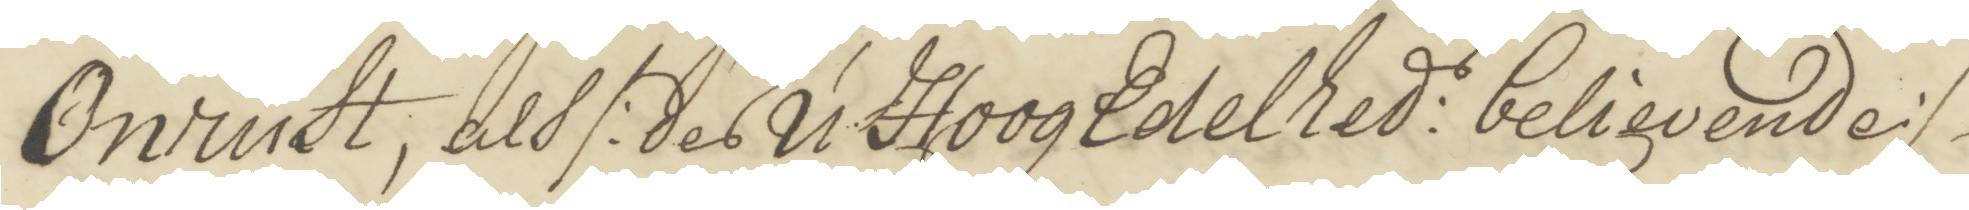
Onrust, als /:des u Hoog Edelhed:s believende:/
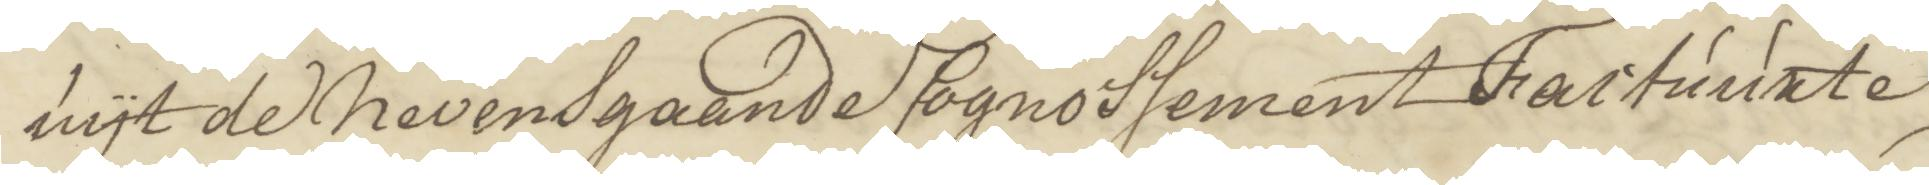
uijt de nevensgaande Cognossement Factuurte
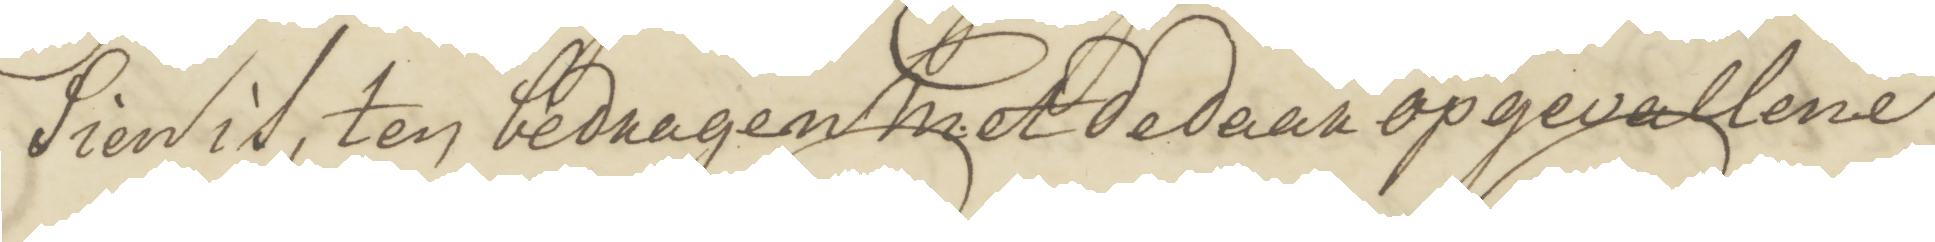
sien is, ten bedragen met de daar op gevallene
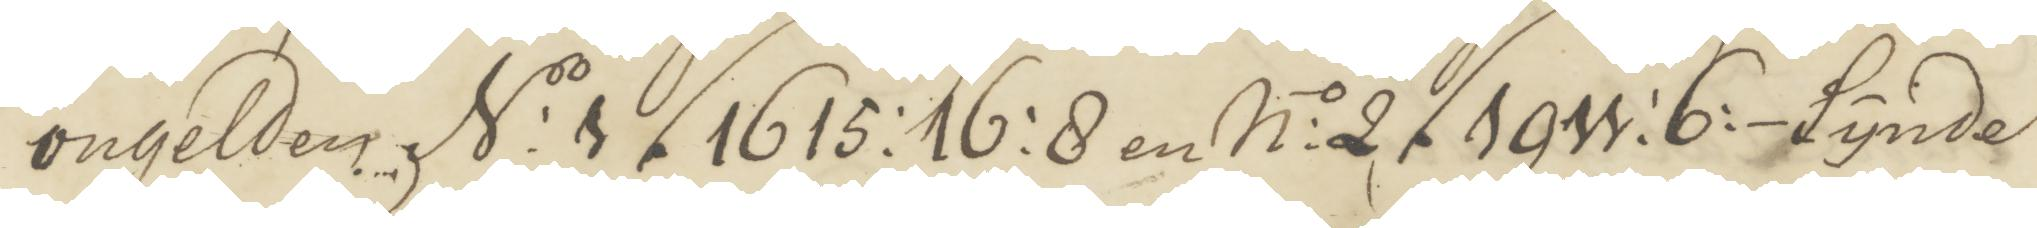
ongelden N:o 1 ƒ1615: 16: 8 en n:o 2 ƒ1911:6:– sijnde
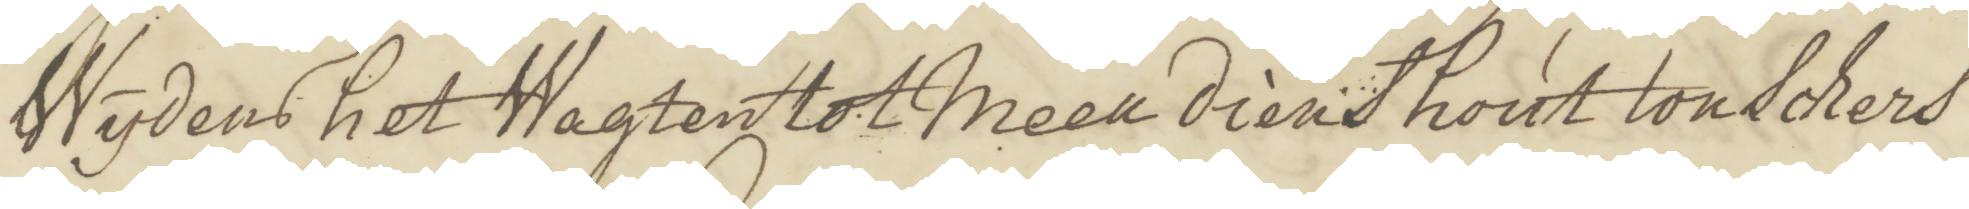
wijders het wagten tot meer diens hout tonschers
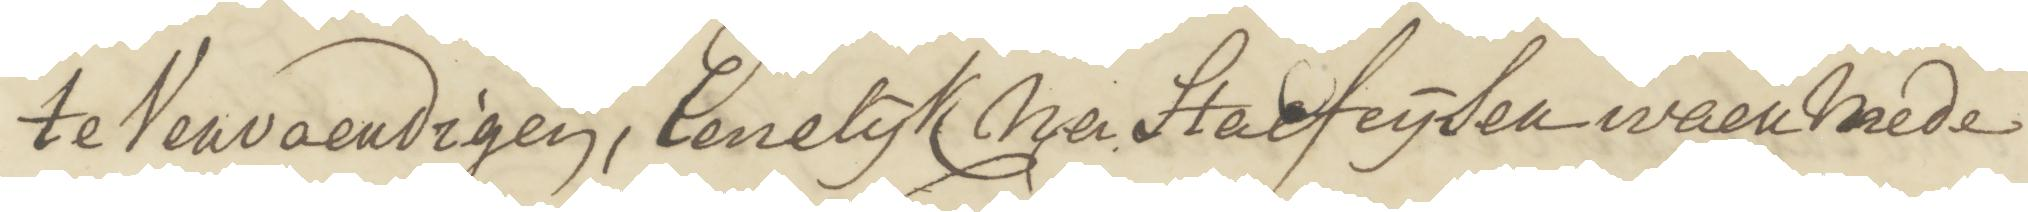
te vervaerdigen, Eenelijk na staefeijser waer mede
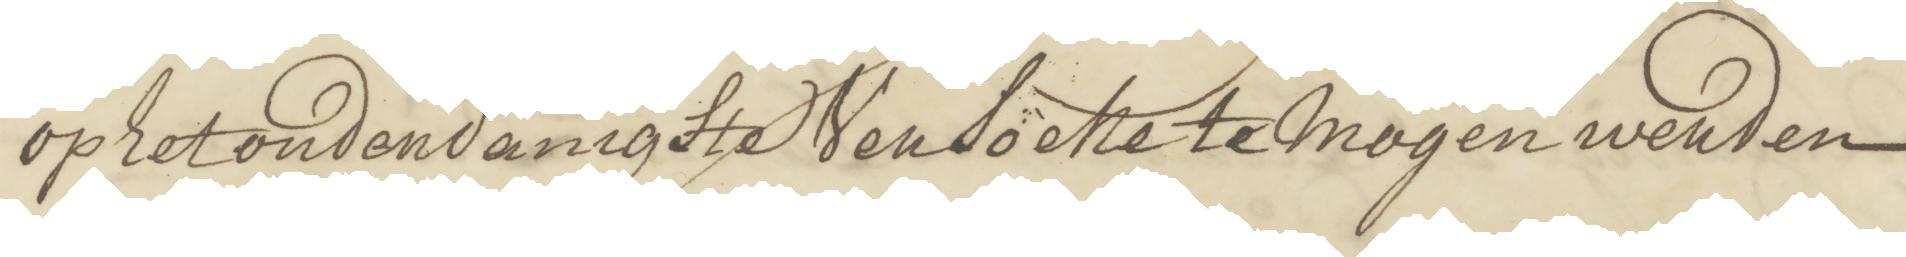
op het onderdanigste versoeke te mogen werden
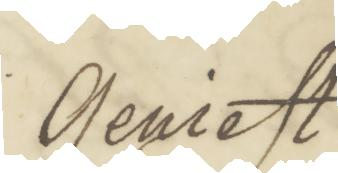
gerieft
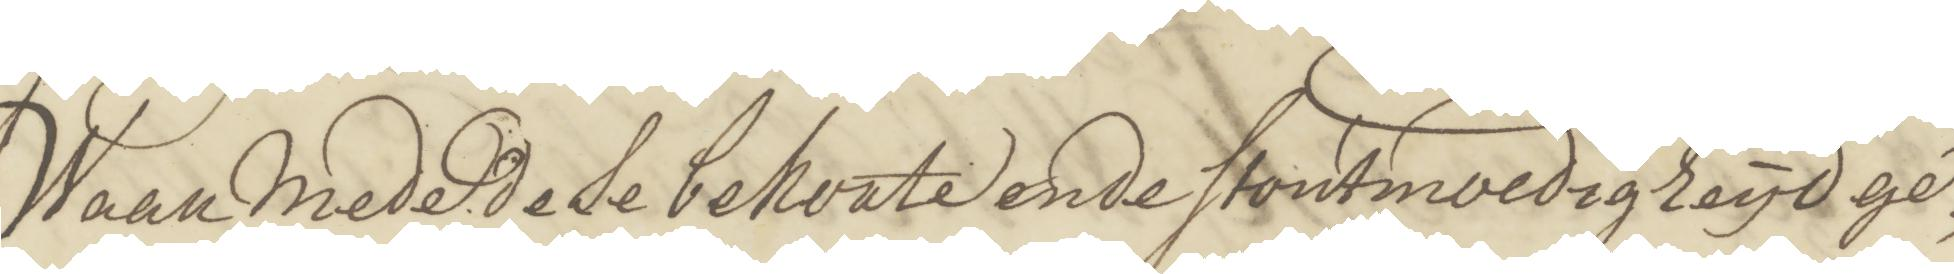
Waar mede dese behorte ende stoutmoedigheijd ge
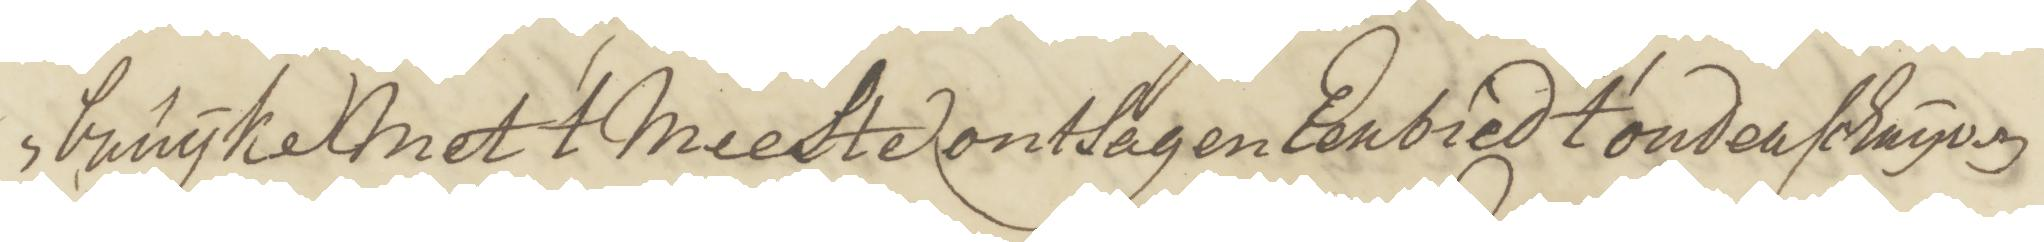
„bruijke met ’t meeste ontsag en Eerbied t' onderschrijven
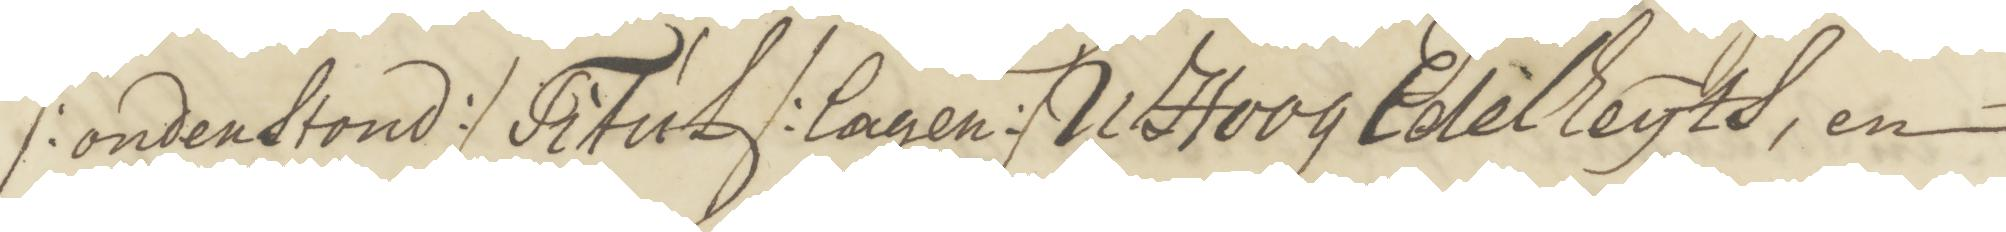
/:onderstond:/ Titul /:lager:/ U Hoog Edelheijts, en
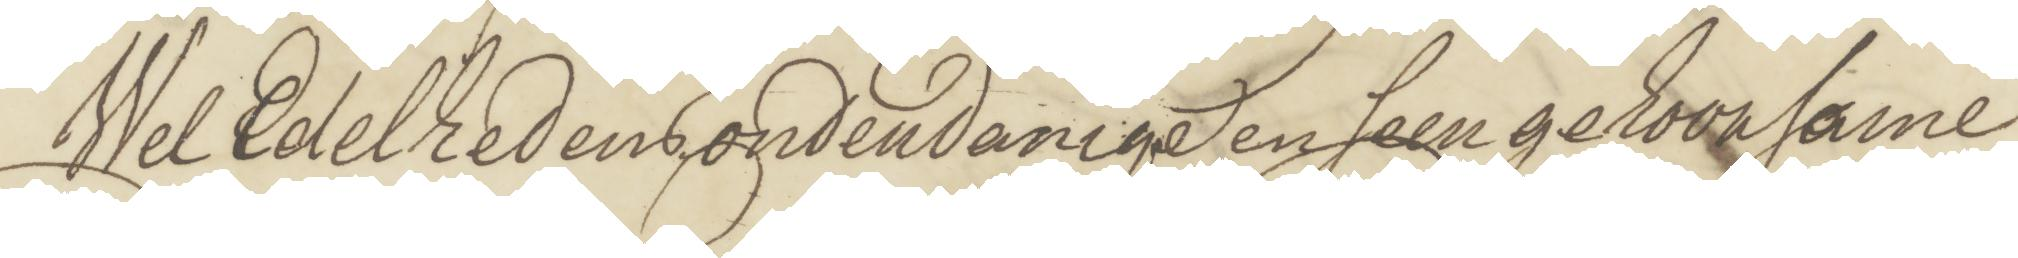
Wel Edelhedens onderdanige en seer gehoorsame
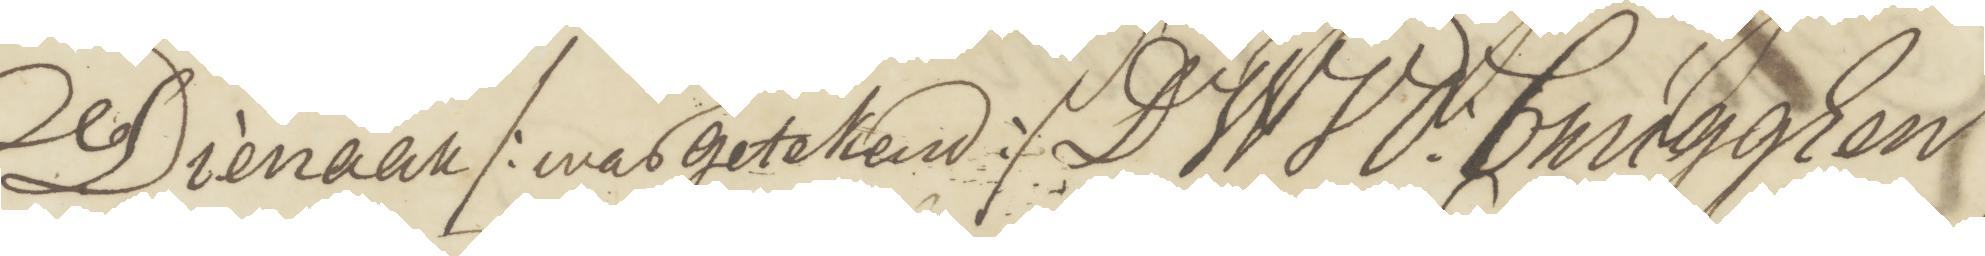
Dienaar /:was getekend:/ DWVd: brugghen
